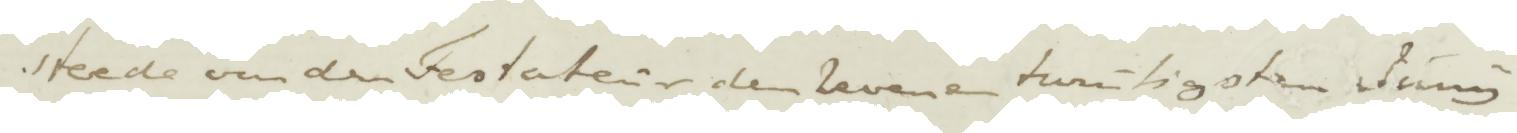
steede van den Testateur den zeven en twintigsten Junij
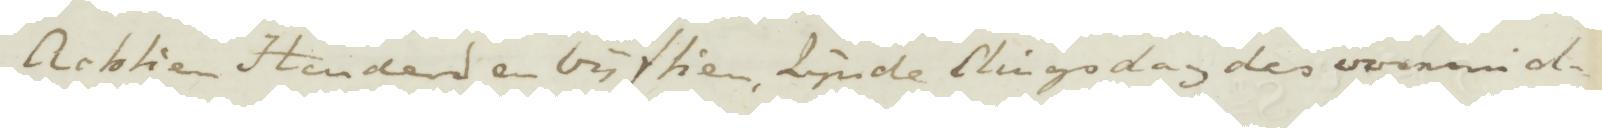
Achtien Honderd en vijftien, zijnde dingsdag des voormid=
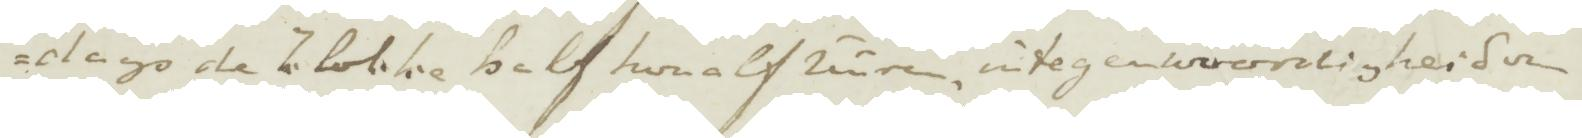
=dags de klokke half twaalf uuren, in tegenwoordigheid van
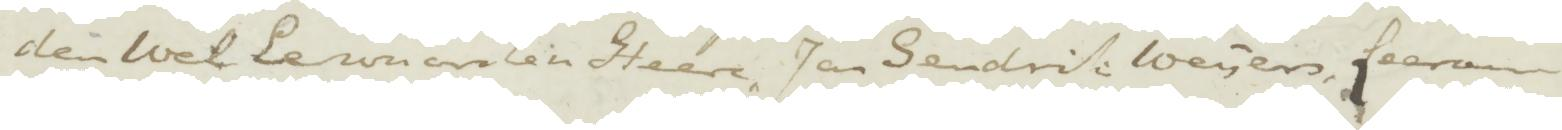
den wel Eerwaarden Heere, Jan Hendrik Weijers, Leeraar
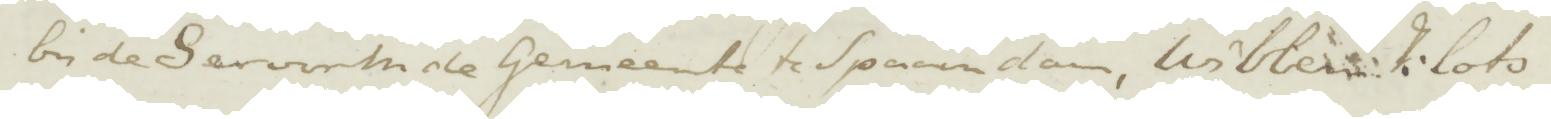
bij de Hervormde Gemeente te Spaarndam, Willem Klots
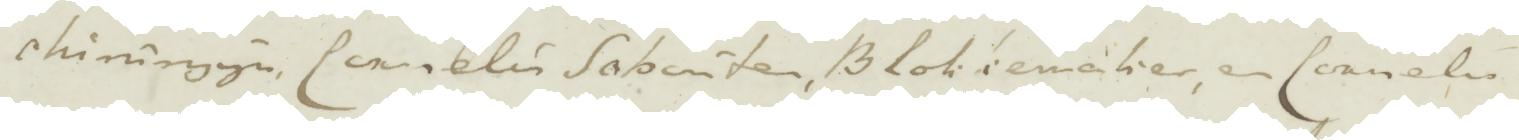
chirurgijn, Cornelis Schouten, Blokkemaker, en Cornelis
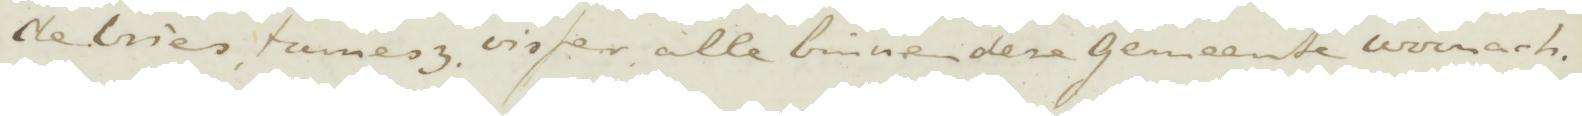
de vries, tamesz. visser, alle binnen deze gemeente woonach.
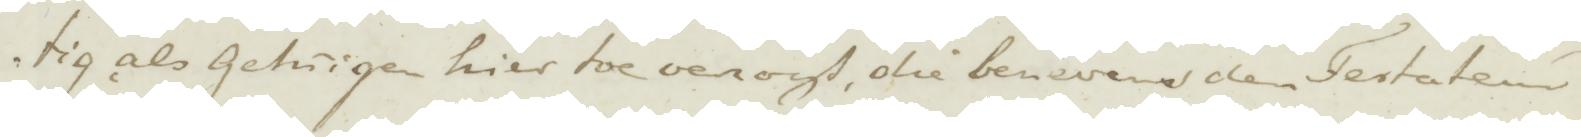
„tig als getuigen hier toe vezogt, die benevens den Testateur
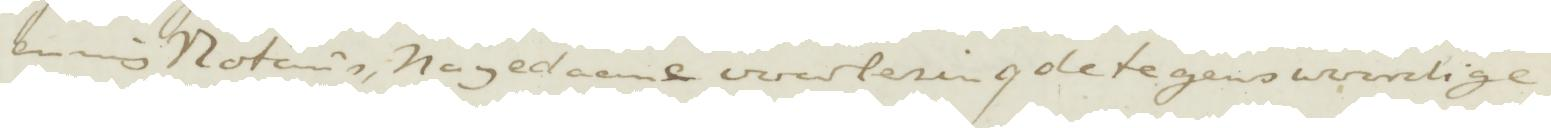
en mij Notaris, Nagedaane voorlezing de tegenswoordige
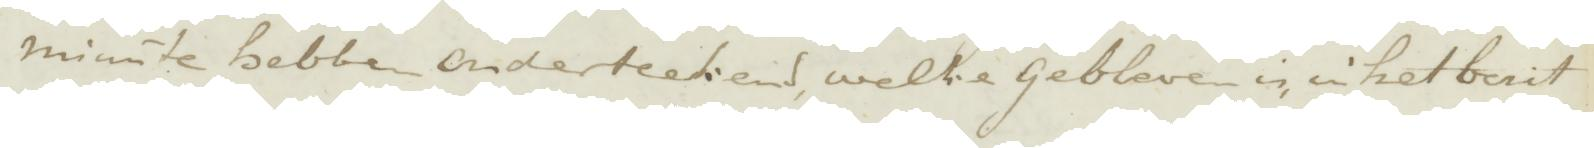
minute hebben onderteekend, welke gebleven is, in het bezit
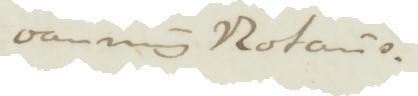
van mij Notaris.
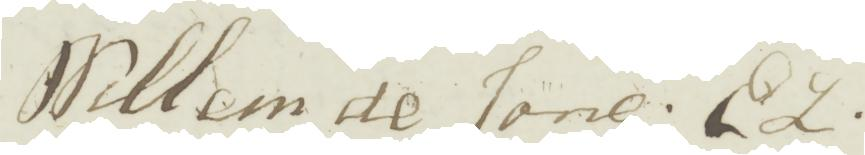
Willem de Jong. EZ.
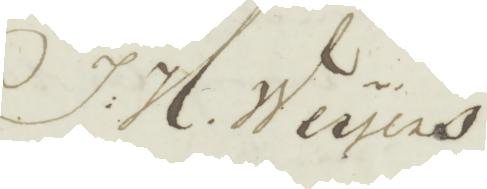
J: H. Weijers
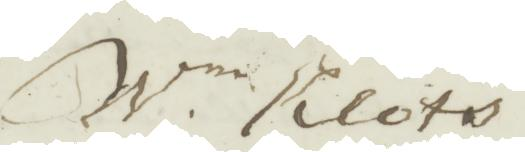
W.m Klots
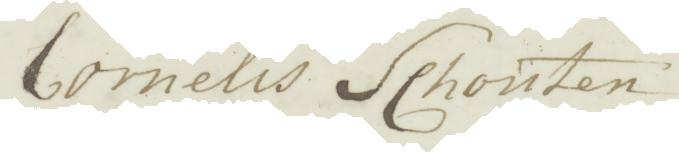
Cornelis Schouten
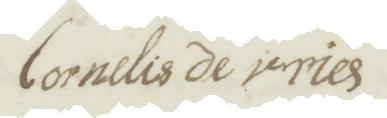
Cornelis de Vries
